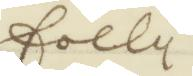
foelij
